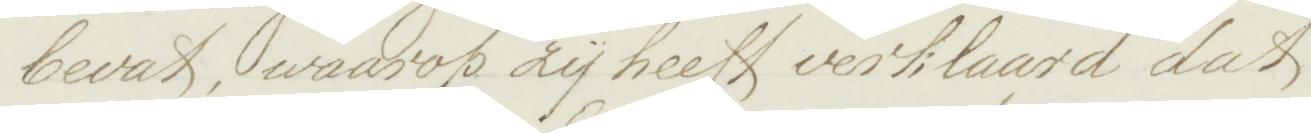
bevat, waarop zij heeft verklaard dat
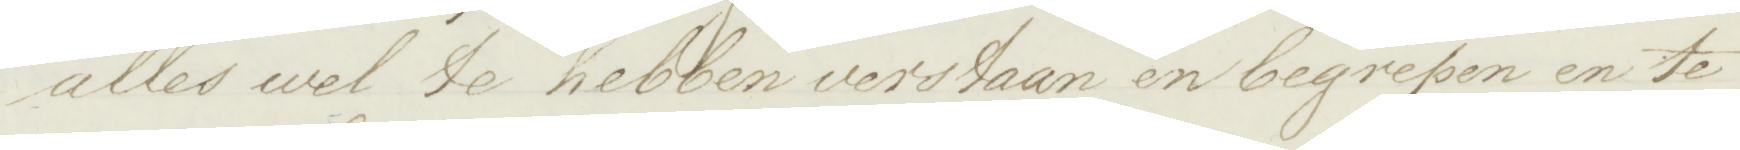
alles wel te hebben verstaan en begrepen en te
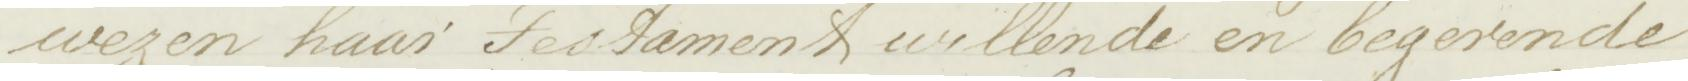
wezen haar Testament willende en begerende
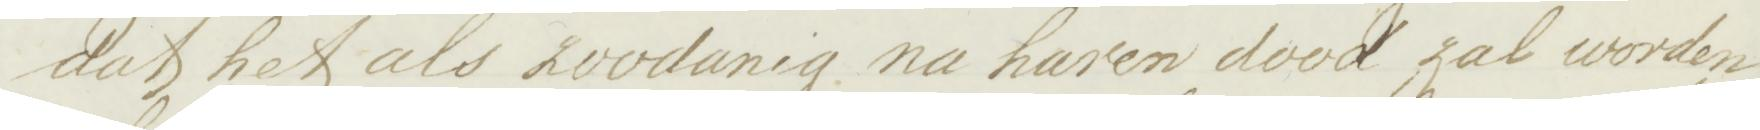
dat het als zoodanig na haren dood zal worden
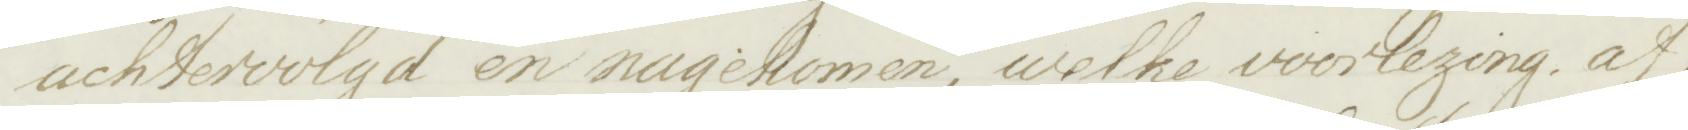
achtervolgd en nagekomen, welke voorlezing, af-
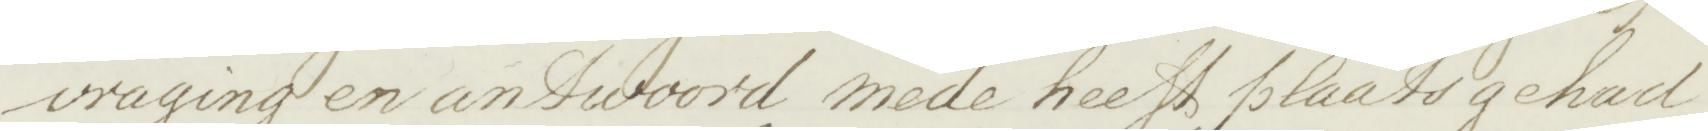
vraging en antwoord mede heeft plaats gehad
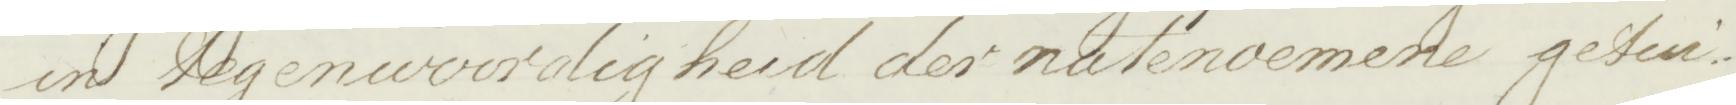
in tegenwoordigheid der natenoemene getui„
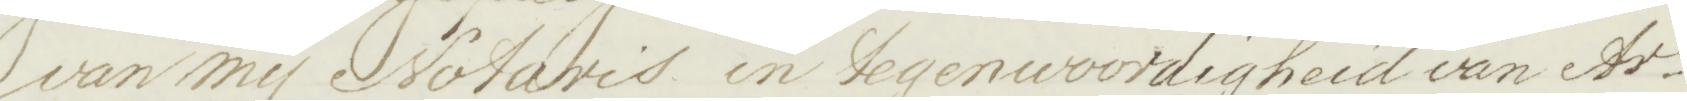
van mij Notaris in tegenwoordigheid van Ar„
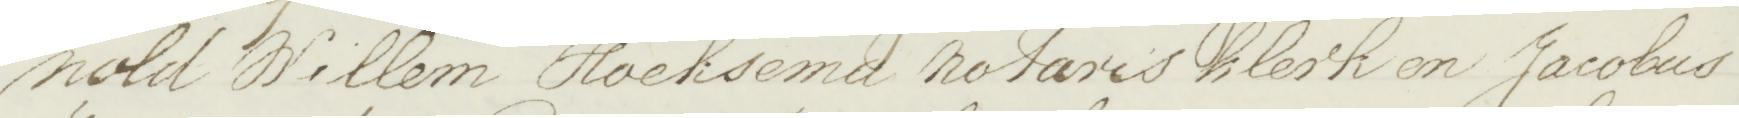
nold Willem Hoeksema notaris klerk en Jacobus
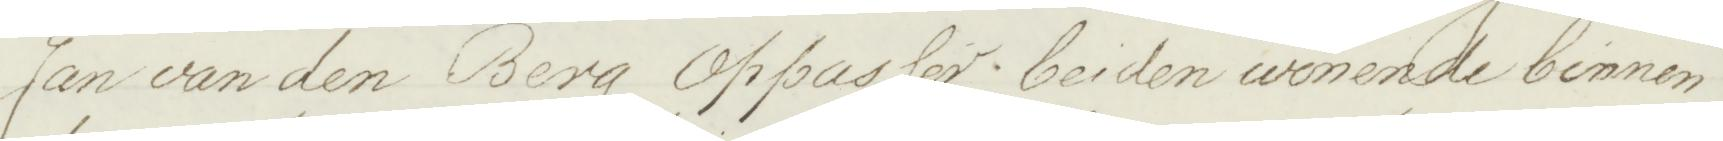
Jan van den Berg Oppasser beiden wonende binnen
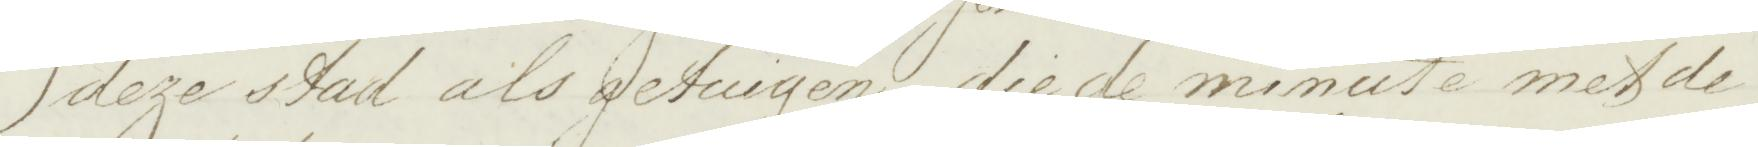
deze stad als getuigen die de minute met de
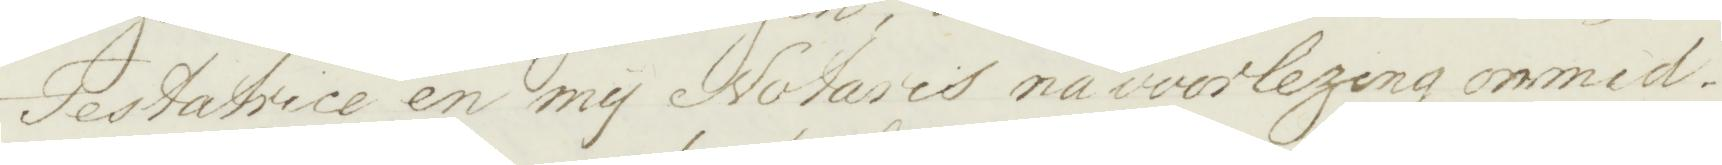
Testatrice en mij Notaris na voorlezing onmid„
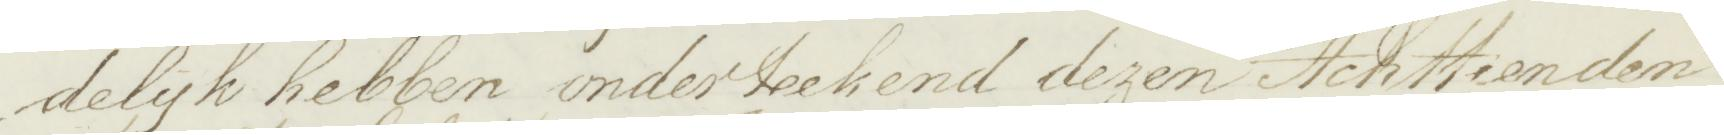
„delijk hebben onderteekend dezen Achttienden
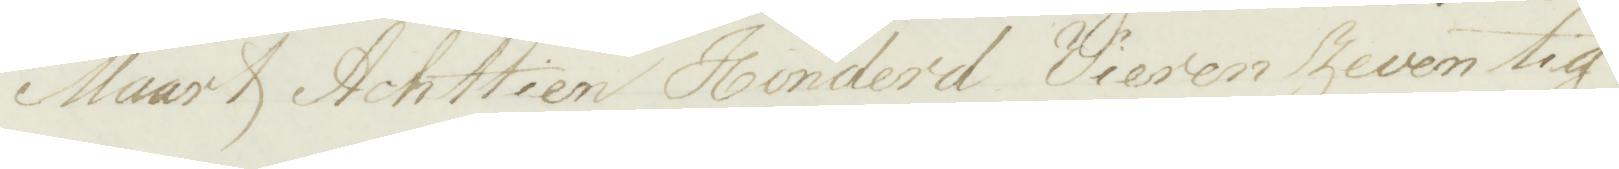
Maart Achttien Honderd Vieren Zeventig
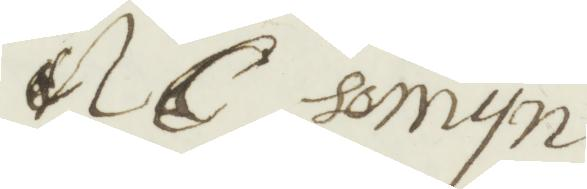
AC Somijn
